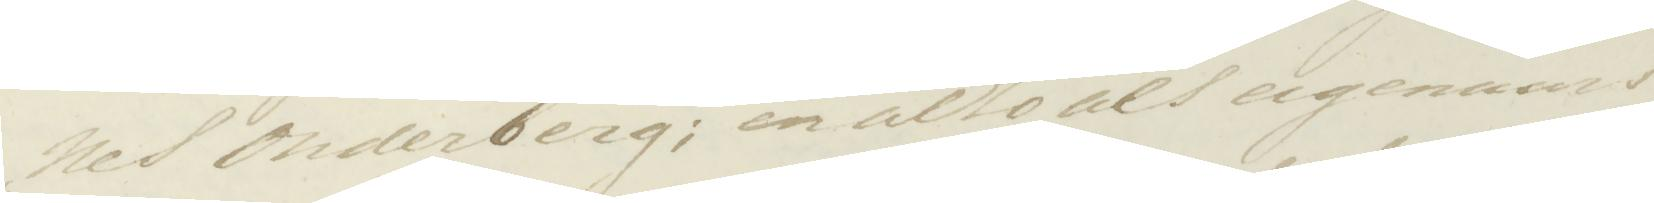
„nes Onderberg; en alzo als eigenaars
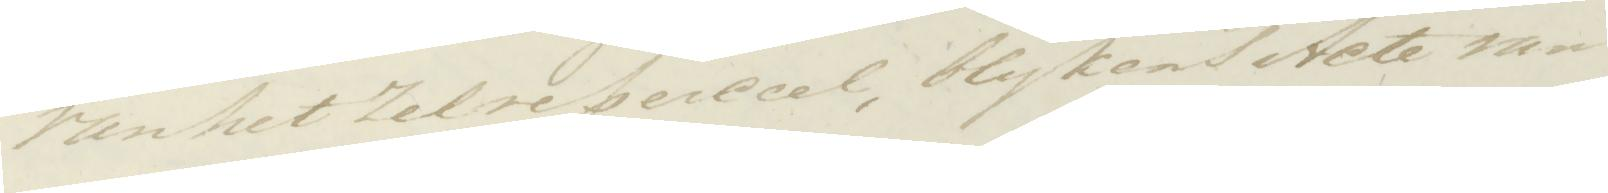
van het zelve perceel, blykens Acte van
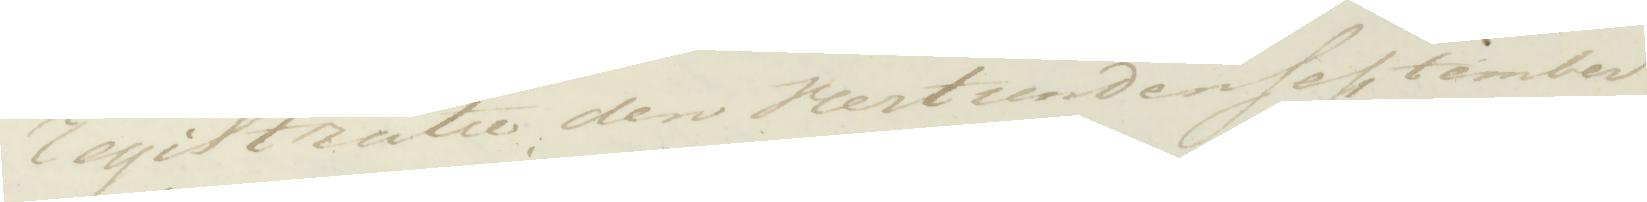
registratie den veertienden september
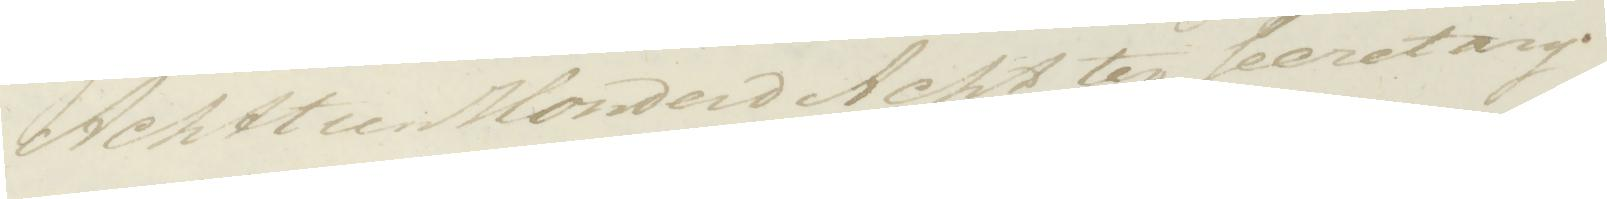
Achttien Honderd Acht ter secretaris
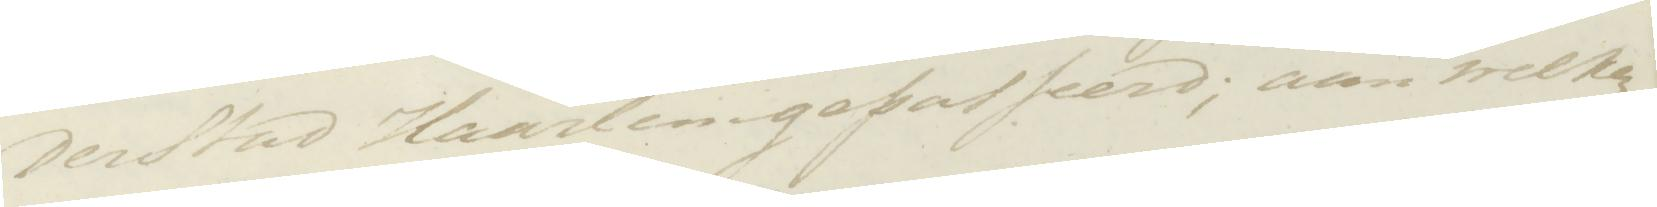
der stad Haarlem gepasseerd; aan welke
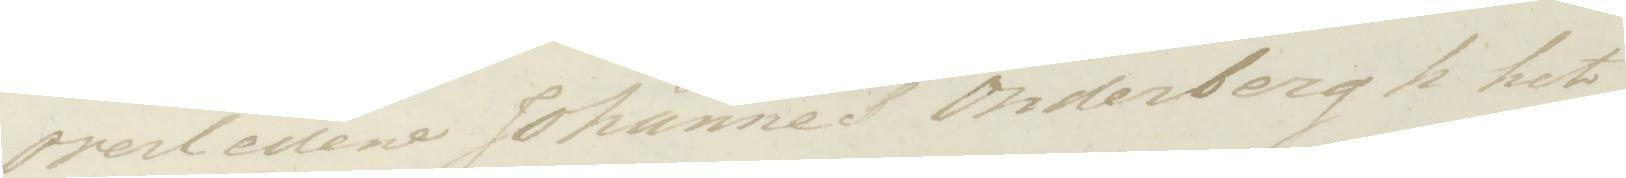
overledene Johannes Onderberg het
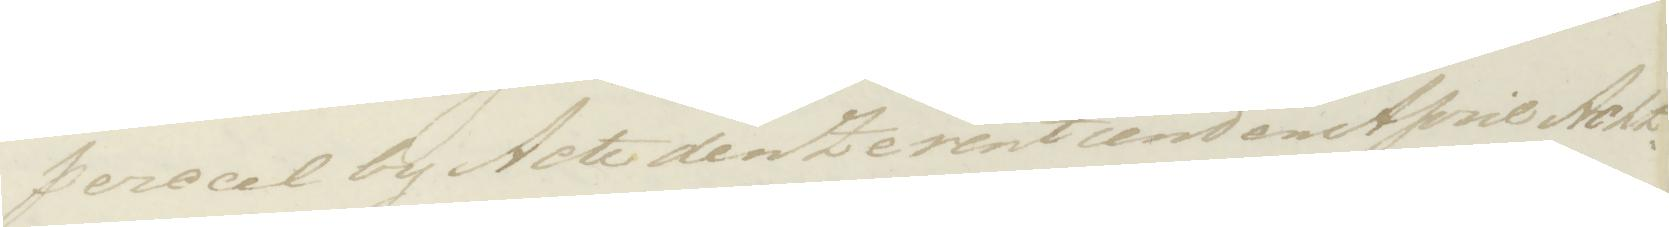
perceel by Acte den Zeventienden April Acht„
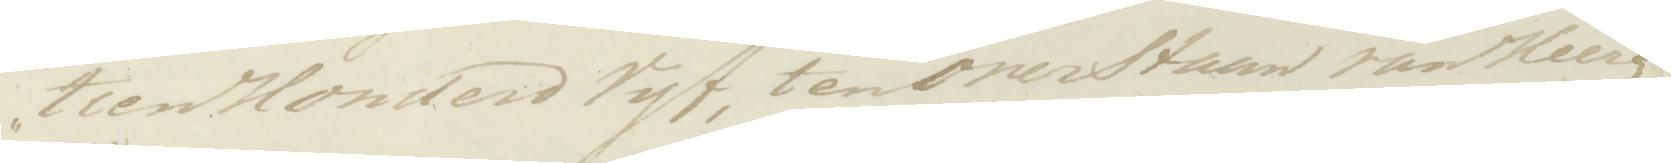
„tien Honderd Vyf, ten overstaan van Heeren
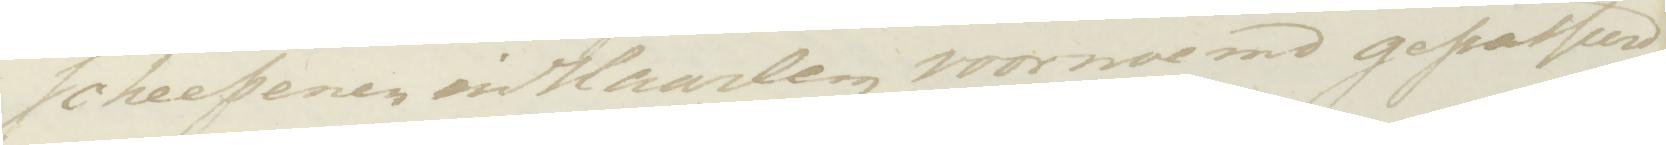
scheepenen in Haarlem voornoemd gepasseerd,
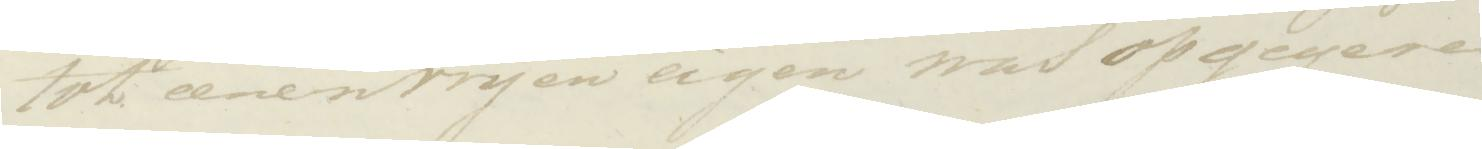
tot eenen vrijen eigen was opgegeven
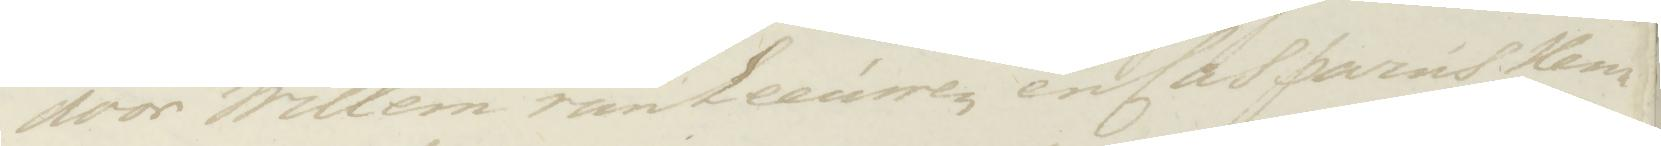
door Willem van Leeuwen en Casparus Hen
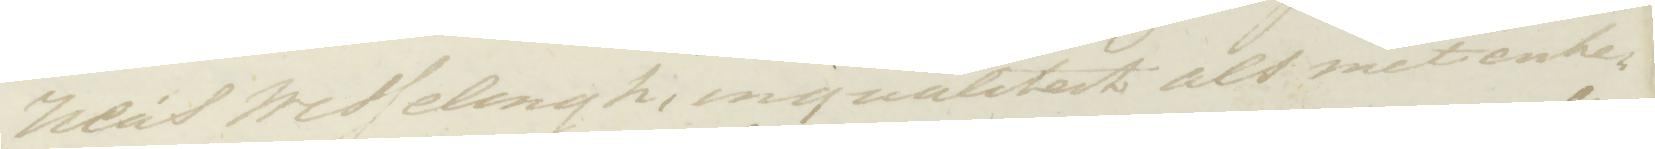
ricus Wesselingh, in qualiteit als met en be„
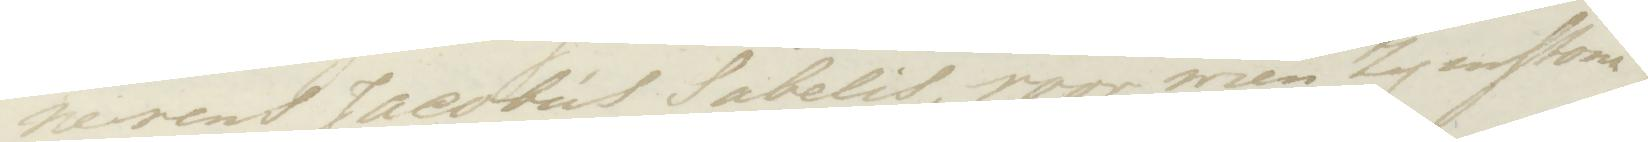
nevens Jacobus Sabelis, voor wien zy inston
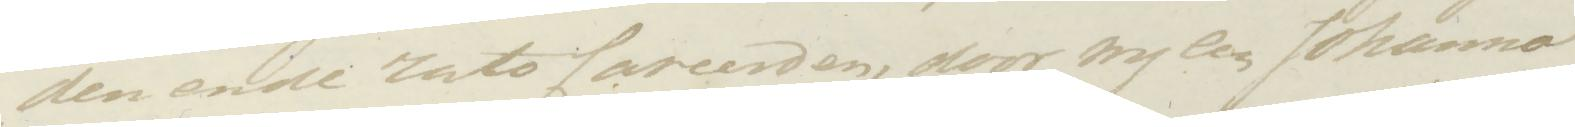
den ende rato Careerden, door wylen Johanna
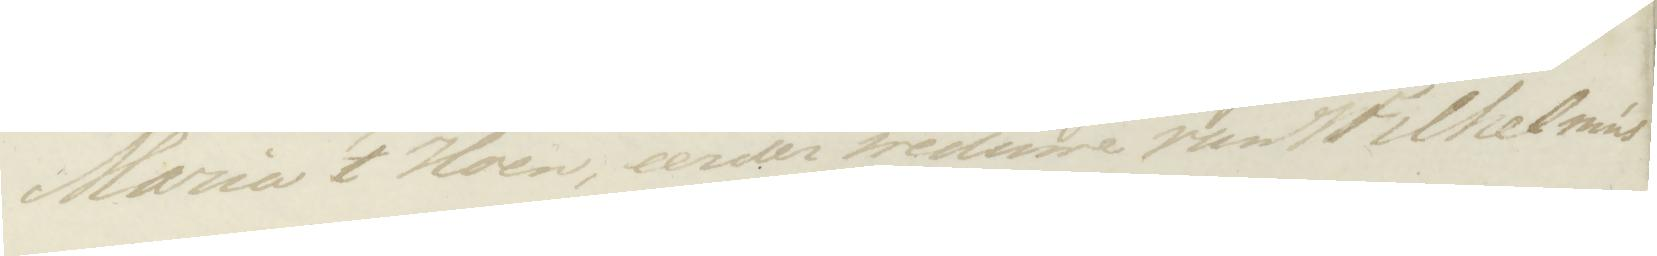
Maria ’t Hoen, eerder weduwe van Wilhelmus
